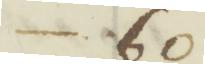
-. 60
